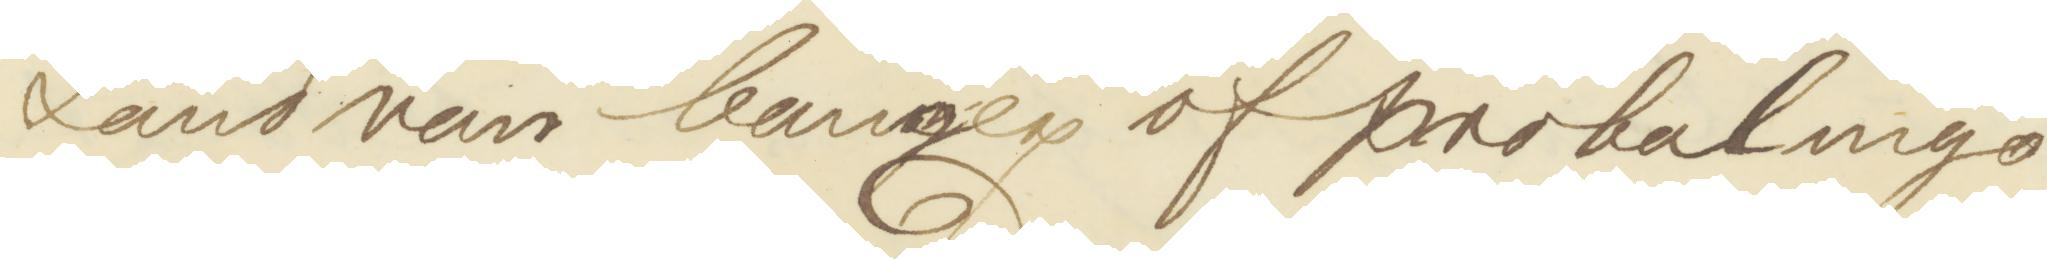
land van banger of probalingo
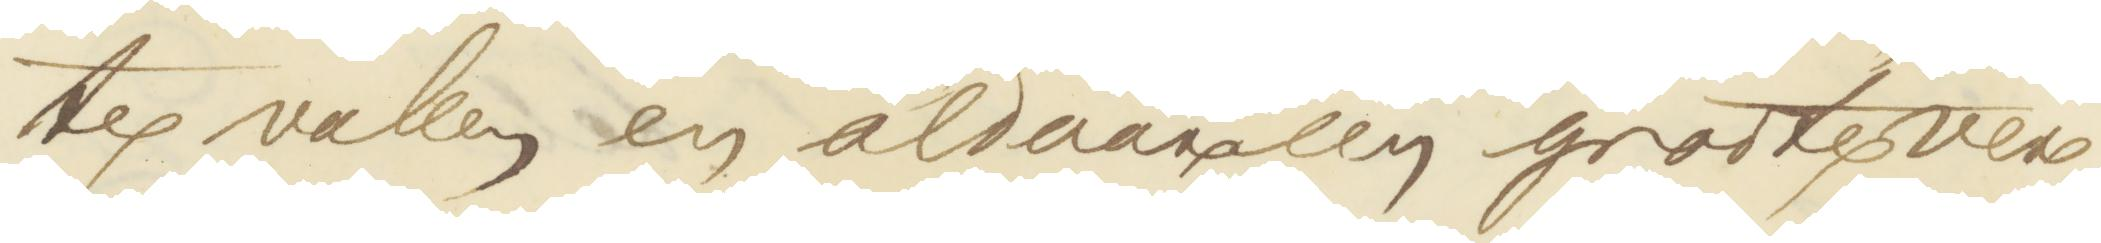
te vallen en aldaar een groote ver
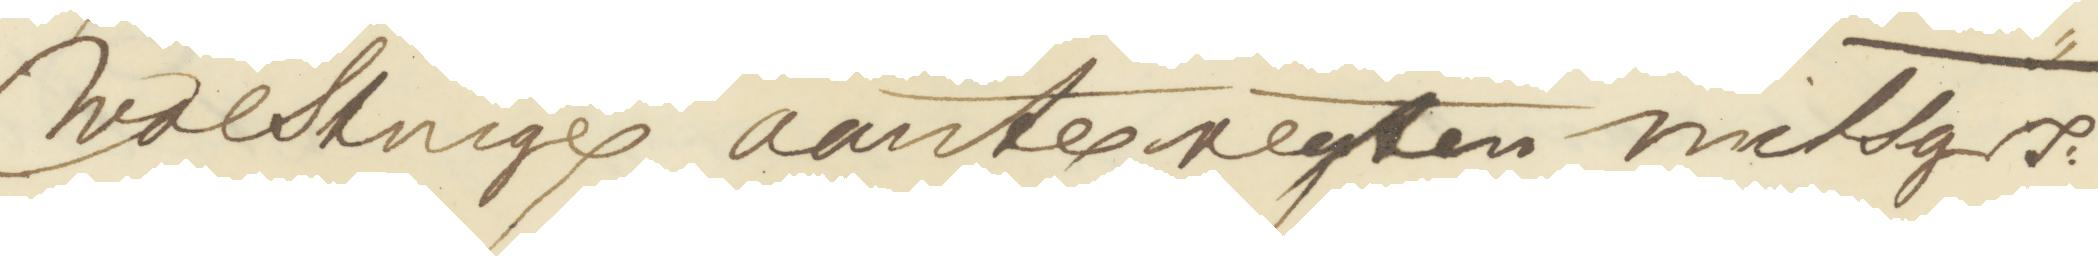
woestinge aante regten mitsgs:
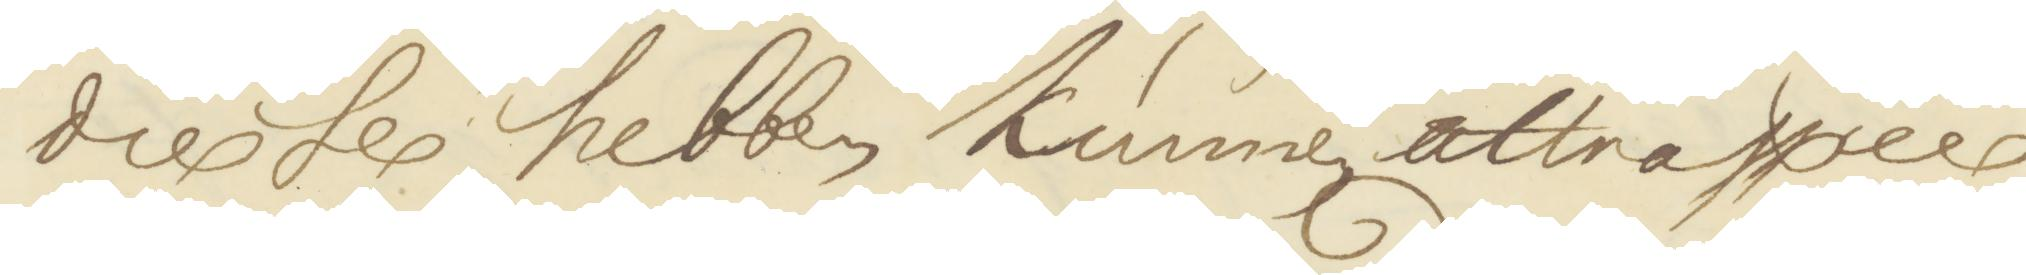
die te hebben kunnen attrappee
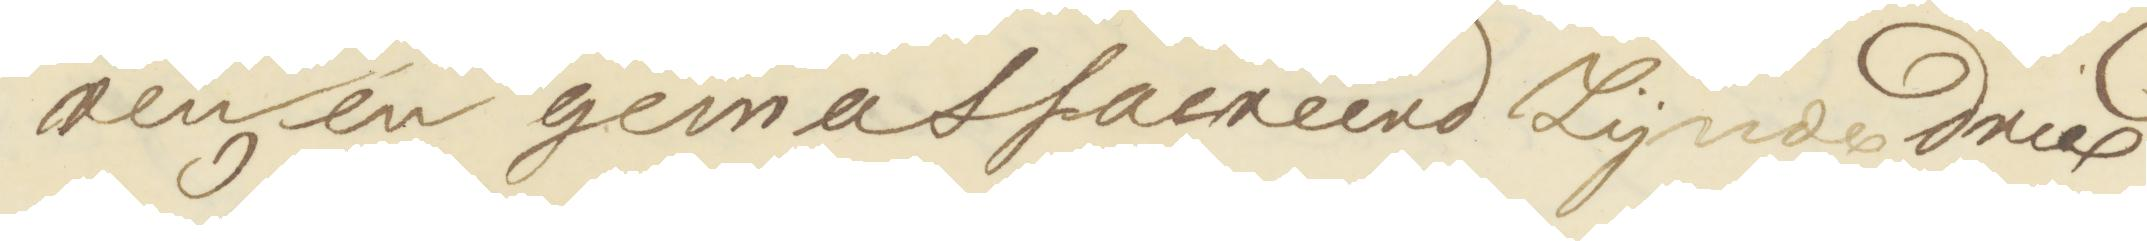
ren en gemassacreerd zijnde drie
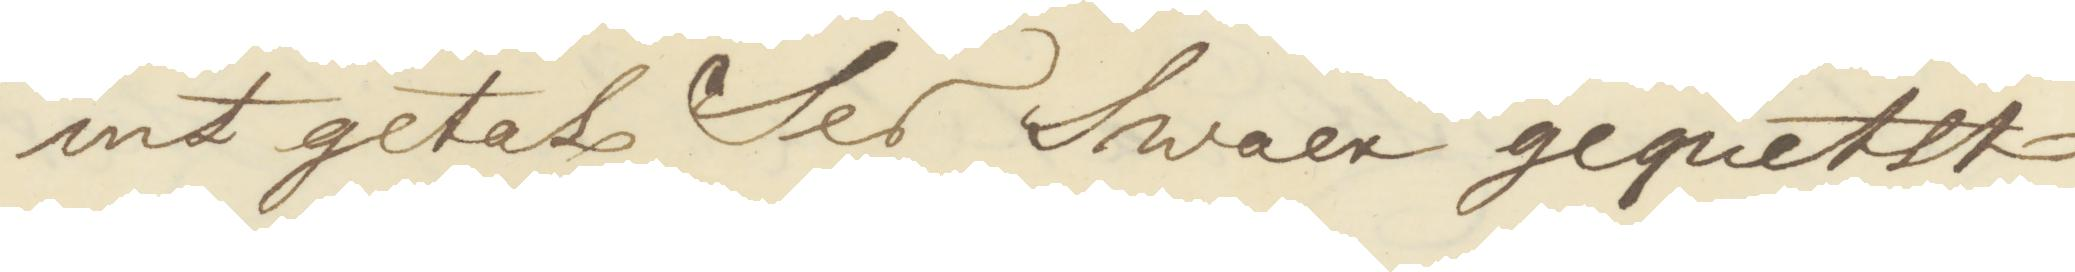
int getal ses swaer gequetst
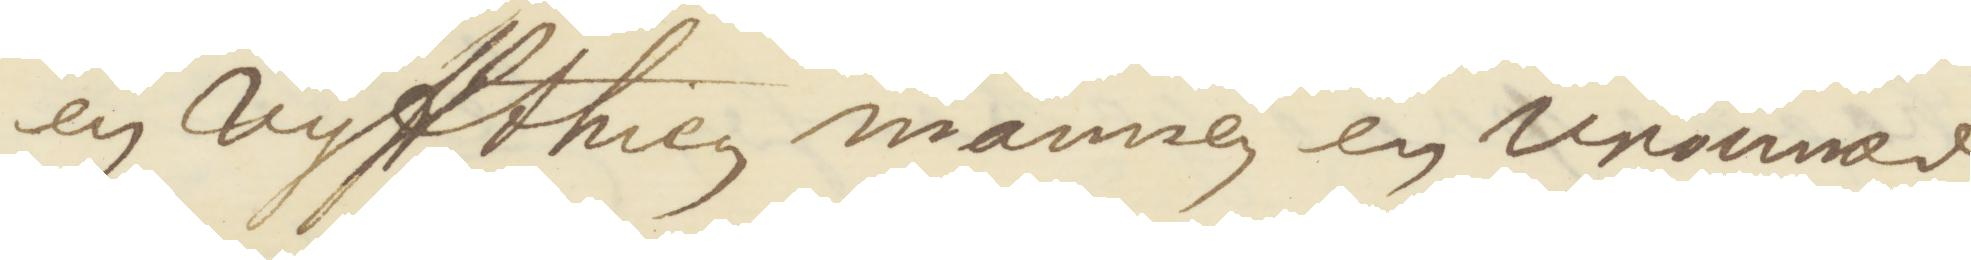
en vijffthien mannen en vrouwen
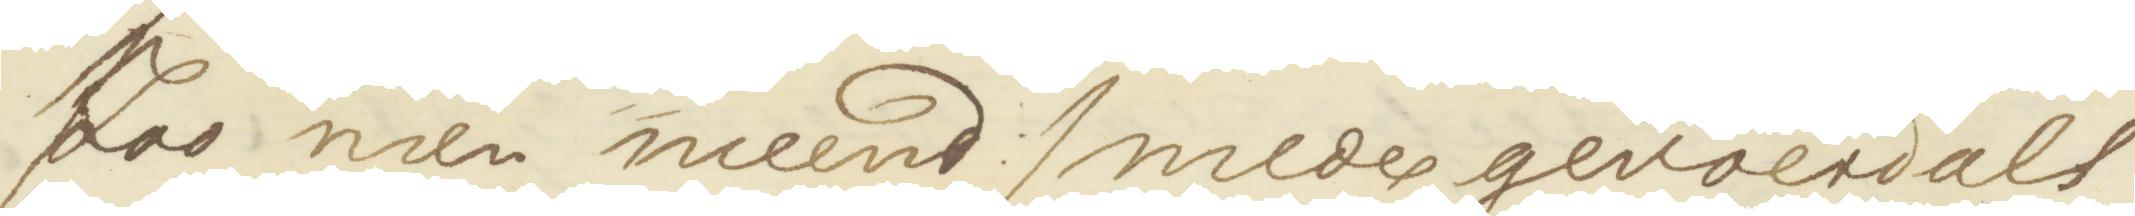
/zoo men meend:/ mede gevoerd als
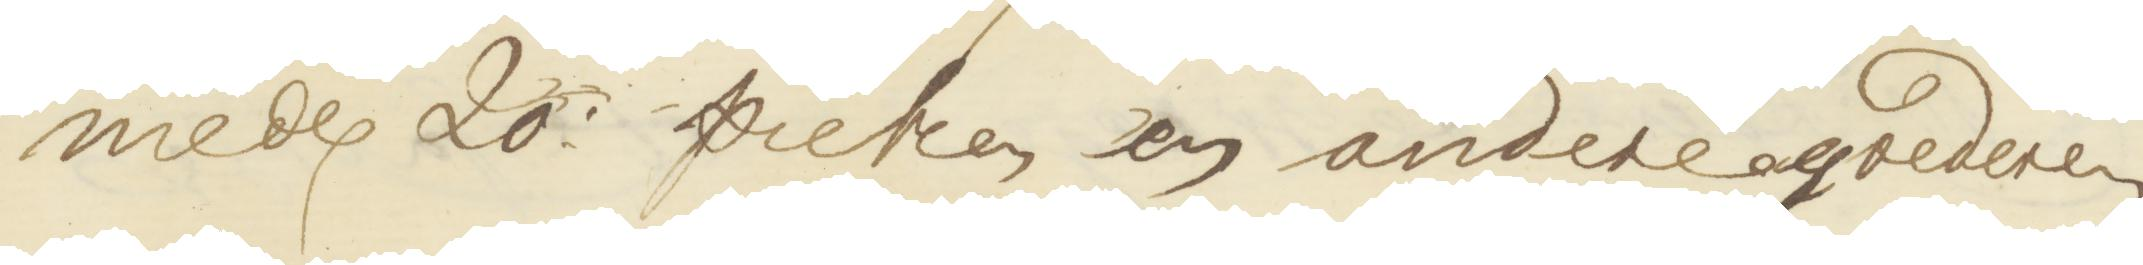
mede 20: pieken en andere goederen
